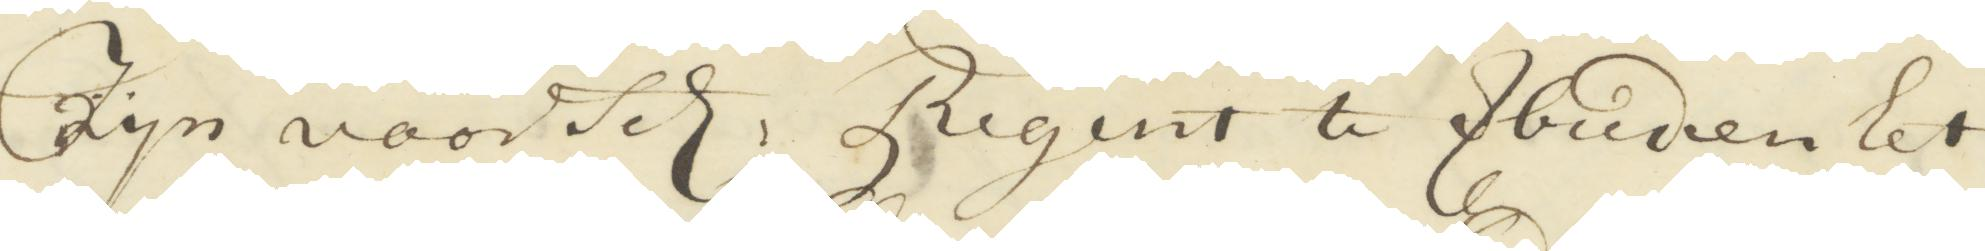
zijn voorsch: Regent te verbieden het
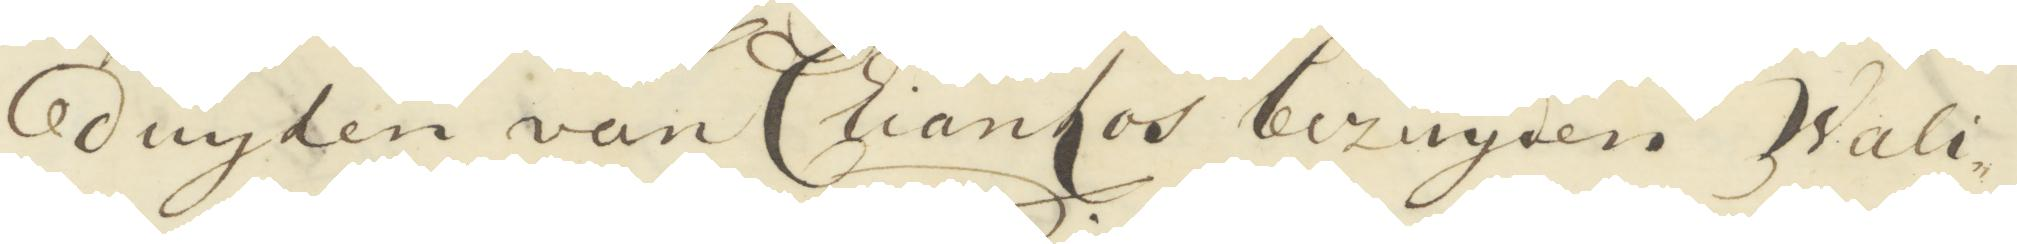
duyden van Chiankos bezuijden Wali„
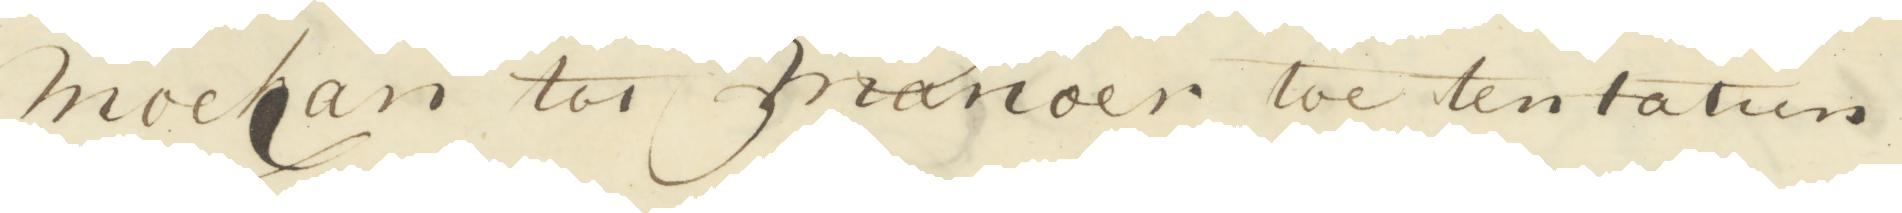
moekan tot manrioer toe tentatien
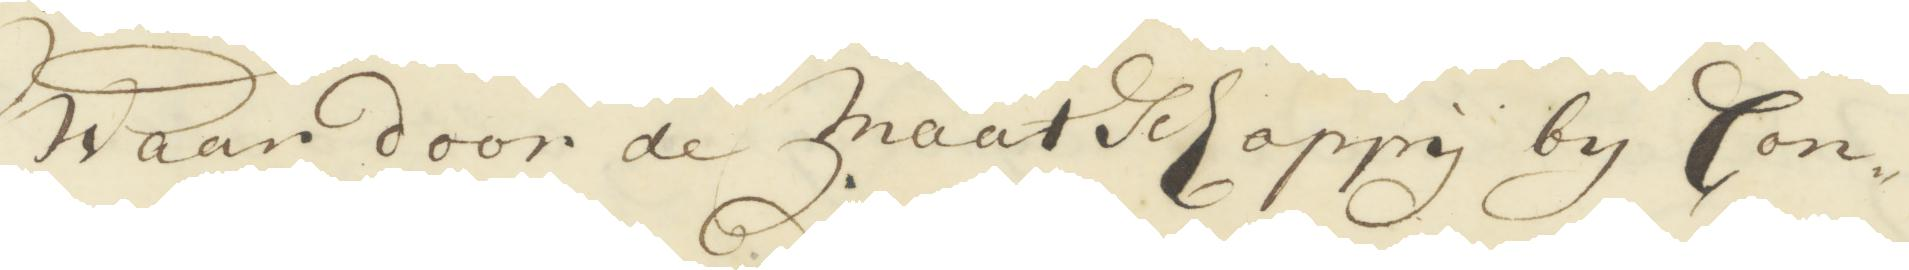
Waar door de maatschappij by Con„
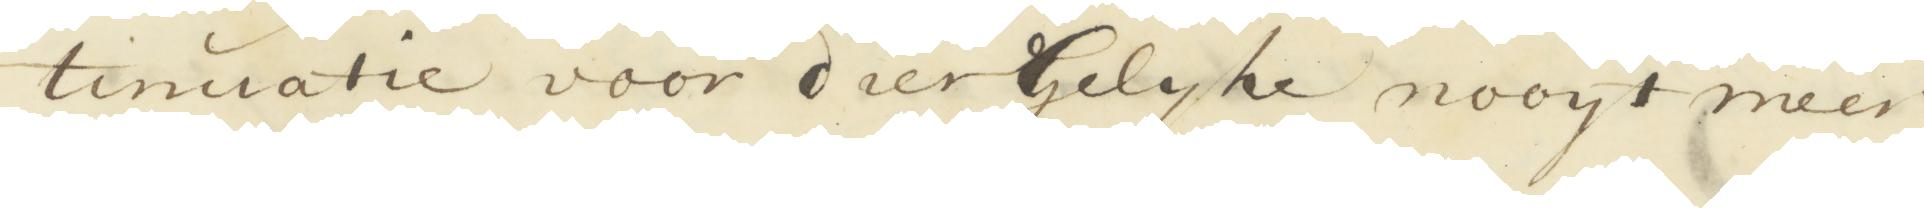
tinuatie voor dier Gelyke nooyt meer
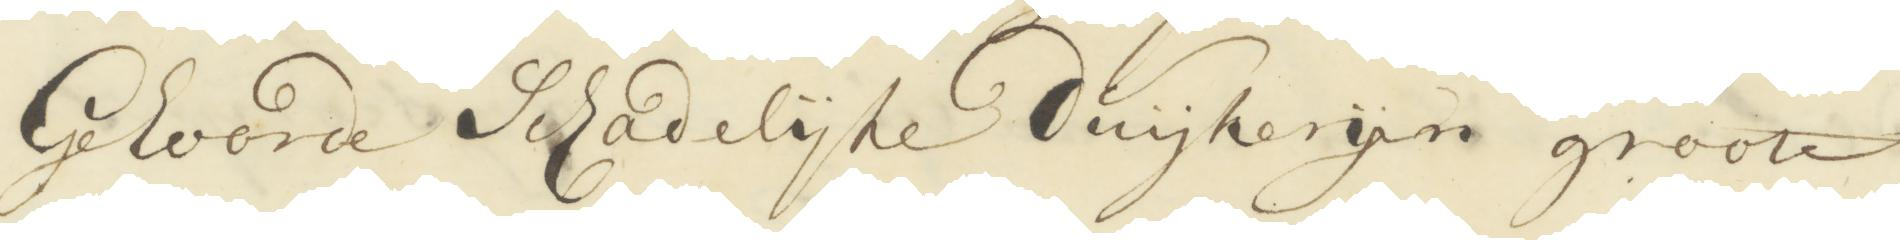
Gehoorde schadelijke duijkerijn groote
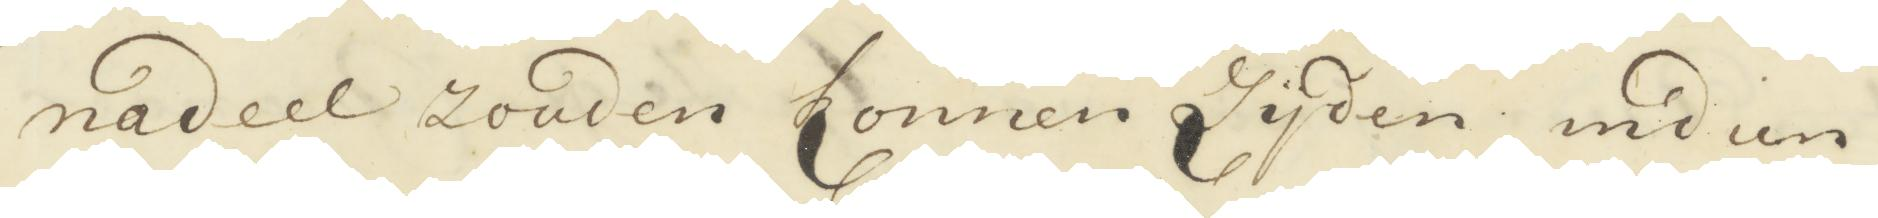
nadeel zouden konnen zijden, indien
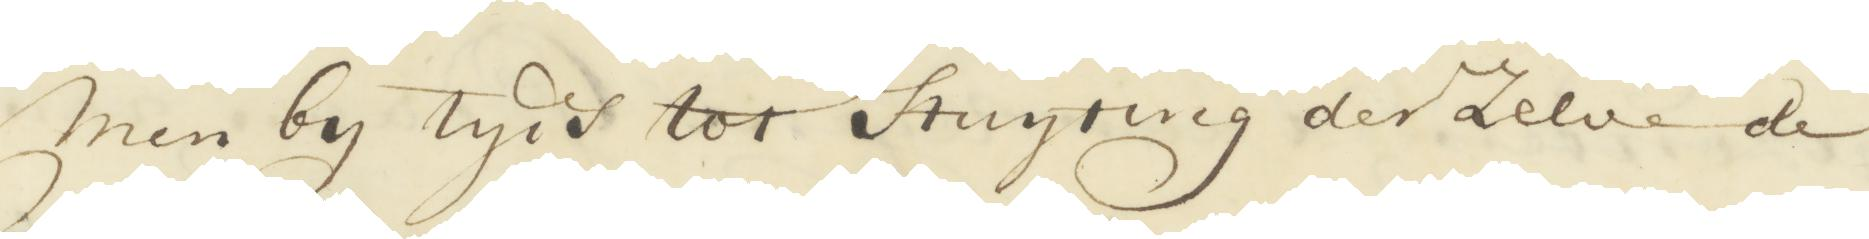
men by tyds tot stuyting derzelve de
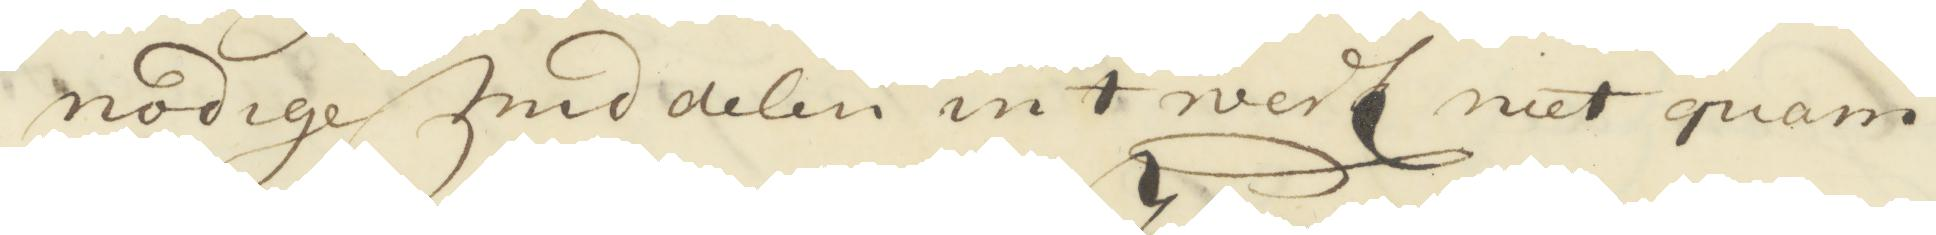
nodige middelen in t werk niet quam
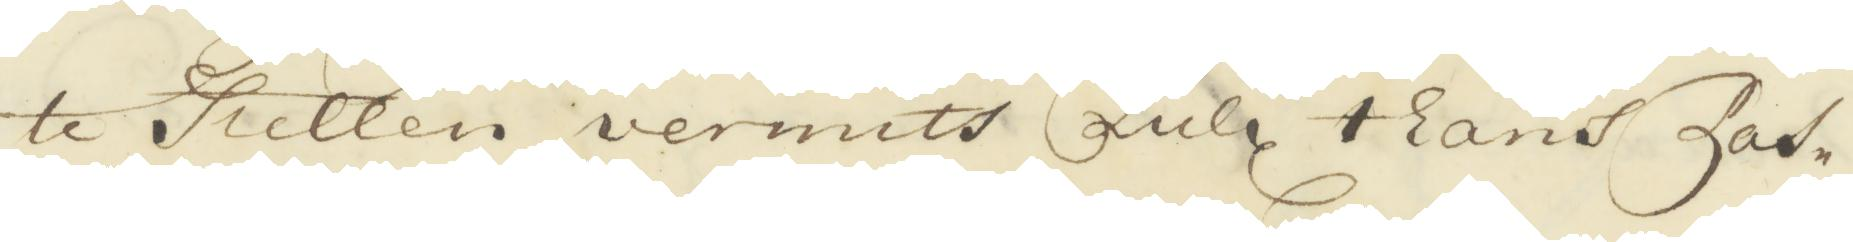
te stellen vermits zulx thans Las„
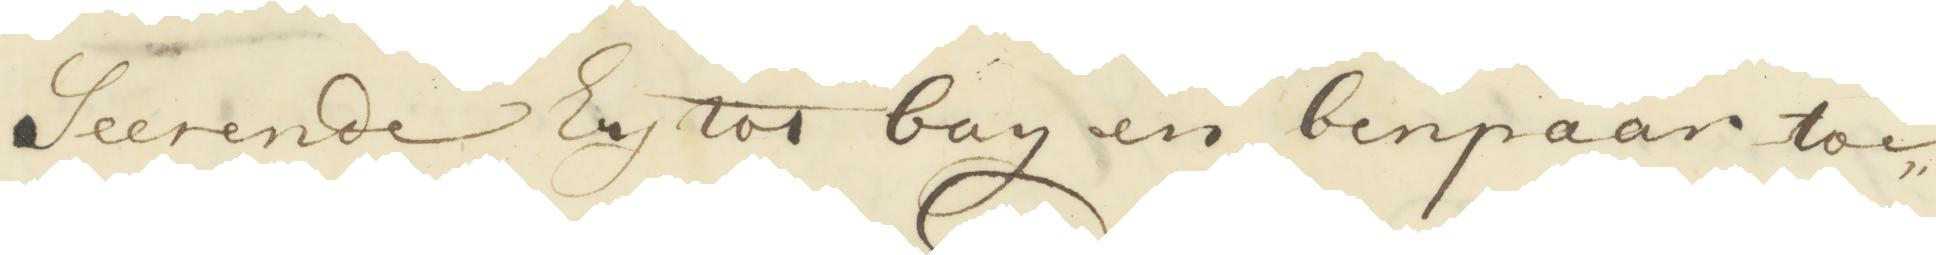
seerende hy tot bay en benpaar toe„
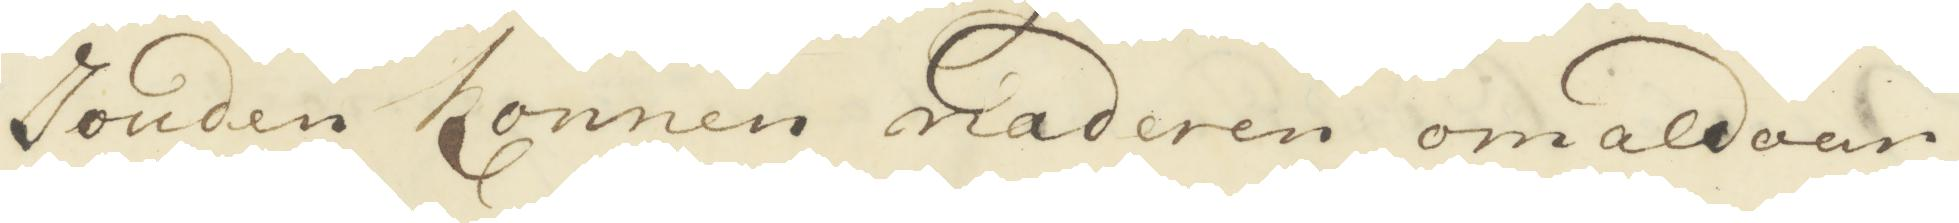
souden konnen naderen om aldaar
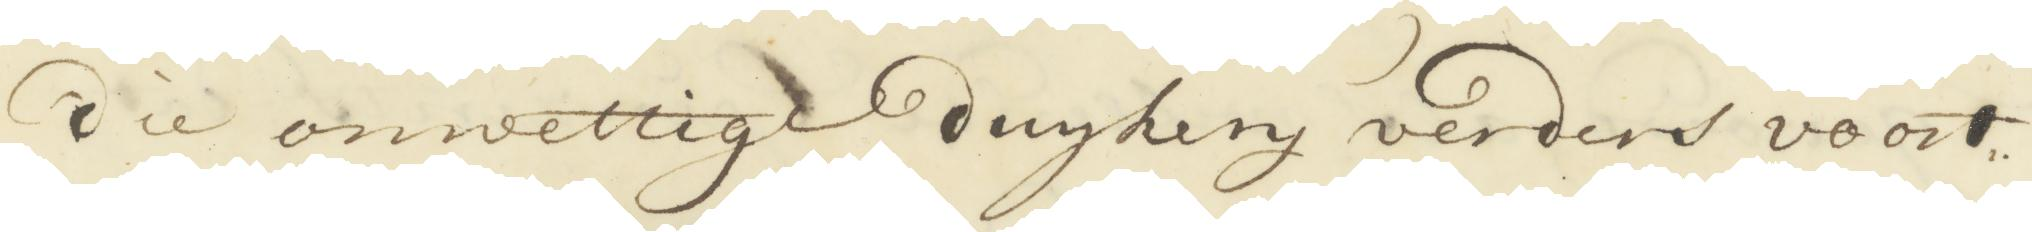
die onwettige duykery verders voort„
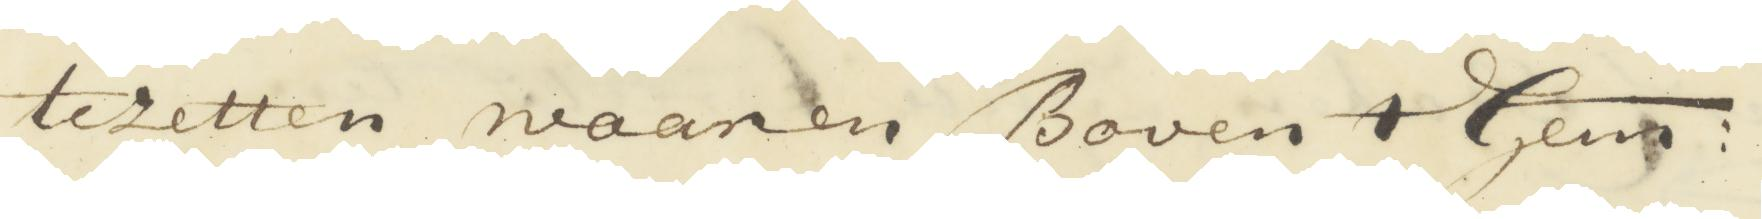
tezetten waaren Boven t Gem:
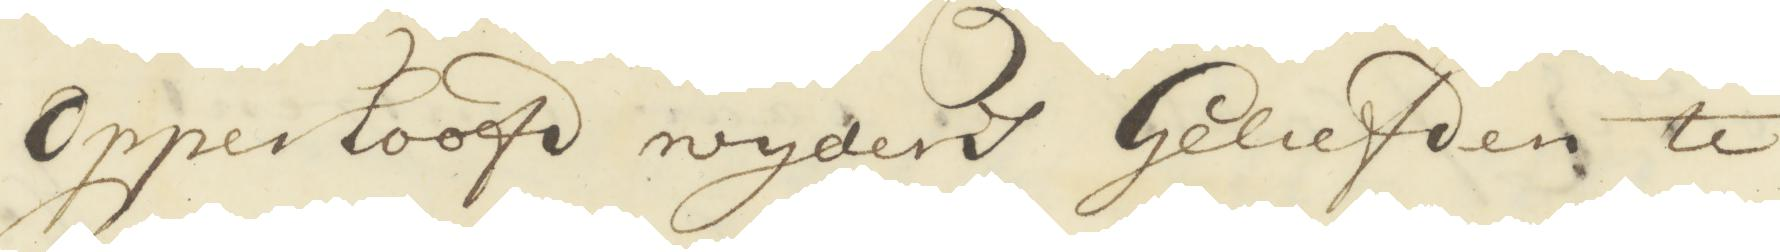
Opperhoofd wyders Geliefden te
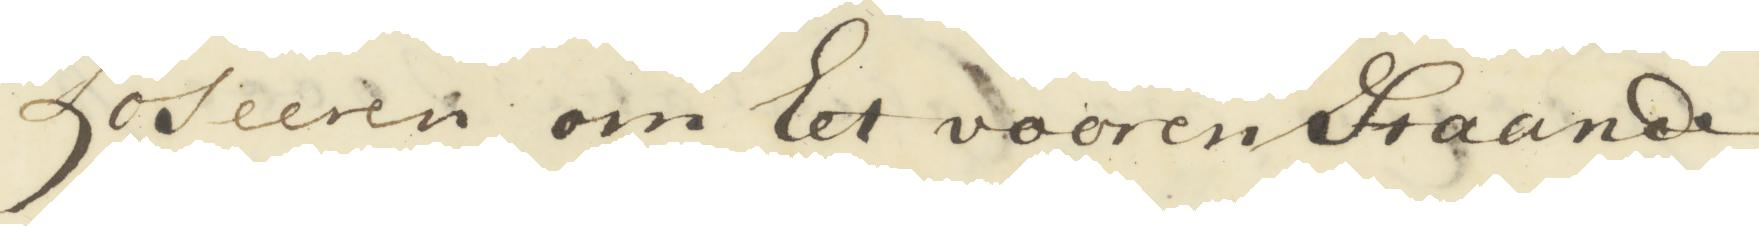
Loseeren om het vooren staande
